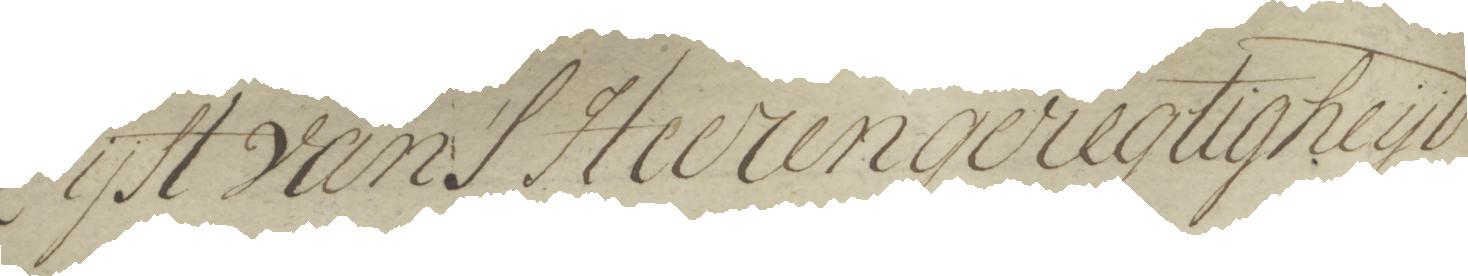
ijst van ’s Heerengeregtigheijd
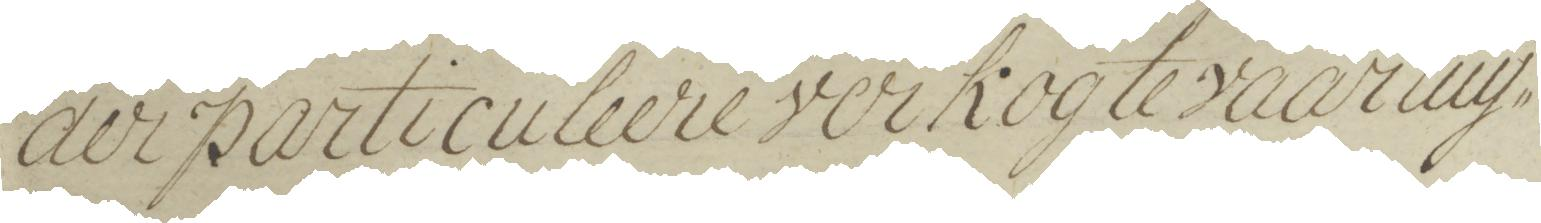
der particuleere verkogte vaartuij„
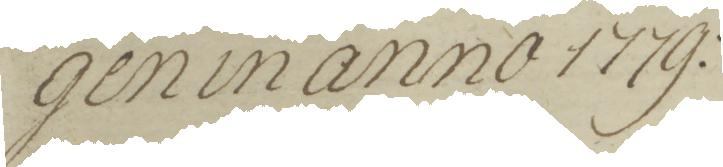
gen in anno 1779:
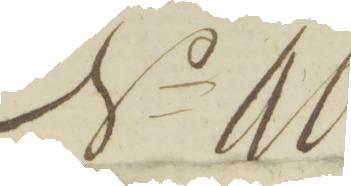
N=o 40
